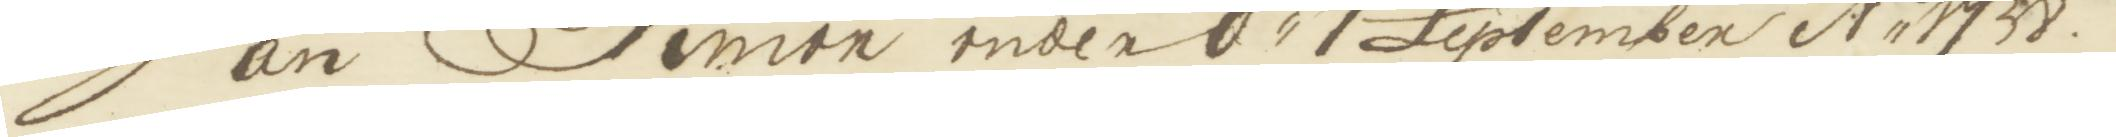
Van Timor onder d„o 7 September A„o 1738.
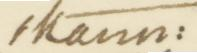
1 kann:
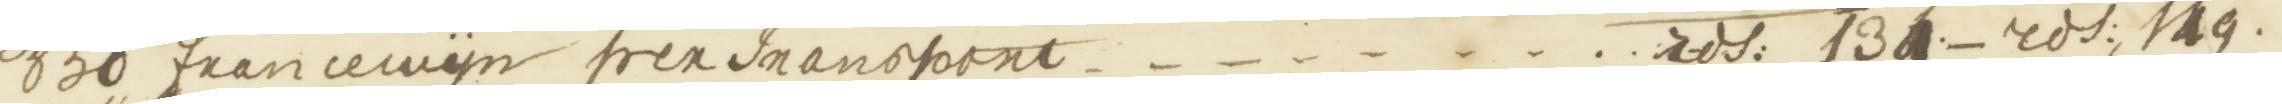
330„ francewijn per Transport - - - - - - - . . rds: 134. — rds: 149.
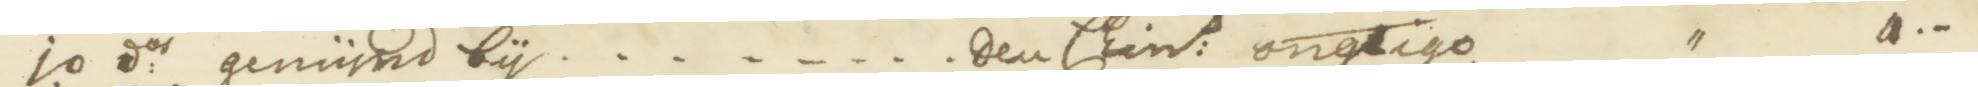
10 d:os gemijnd bij . - - - - - - - den Chin:s ongtigo „ 4. —
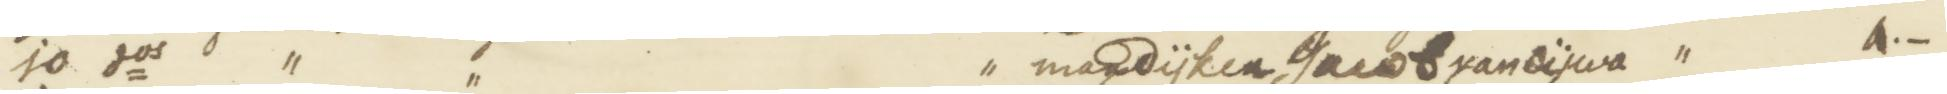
10 d=os „ „ „ mardijker Jacob van dijwa „ 4. —
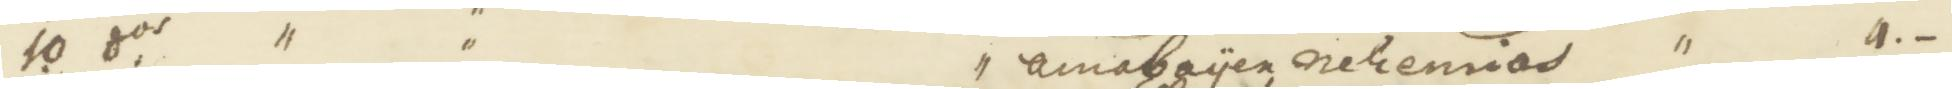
10 d:os „ „ „ amabaijer nehemias „ 4. —
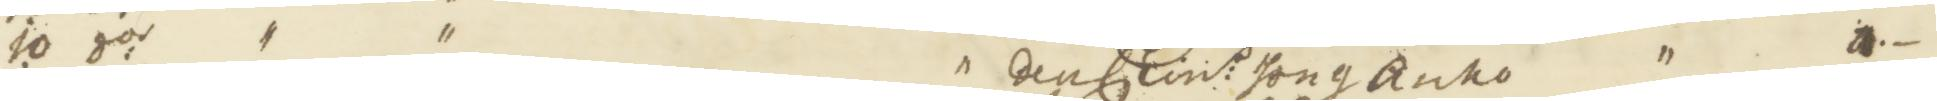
10 d:os „ „ „ den Chin:s Jong Anko „ 4. —
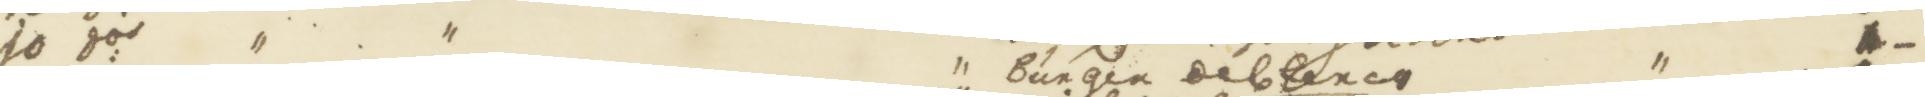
10 d:os „ „ „ Burger declercq „ 4. —
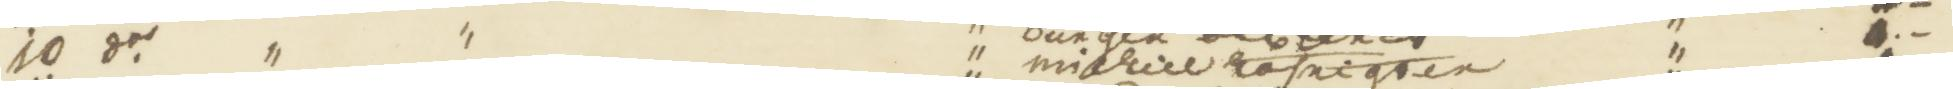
10 d:os „ „ „ michiel hofrigter „ 4. —
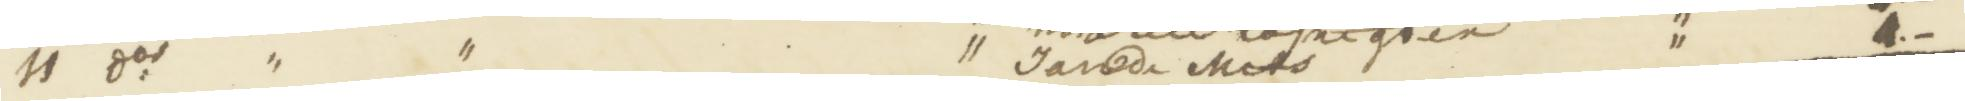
11 d:os „ „ „ Jan de Mets „ 4. —
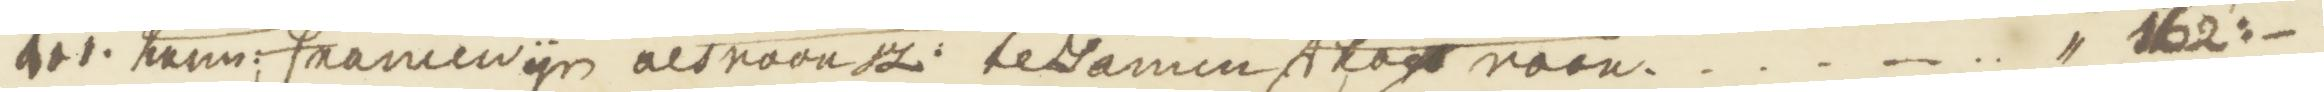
401. kann: francewijn als voorsz: tezamen verkogt voor . . . . . . . . „ 162: —
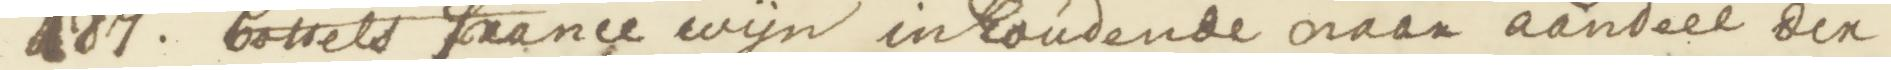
487. bottels france wijn inhoudende naar aandeel der
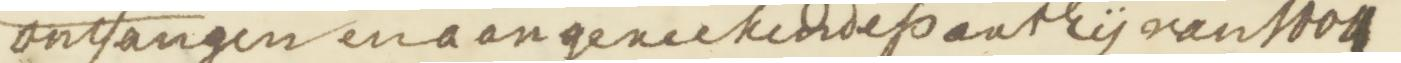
ontfangen en aan gereekende parthij van 1004
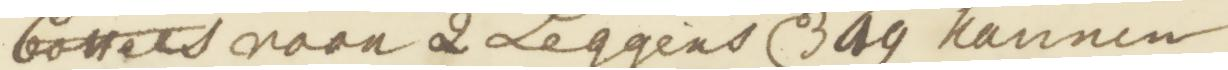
bottels voor 2 Leggers 349 kannen
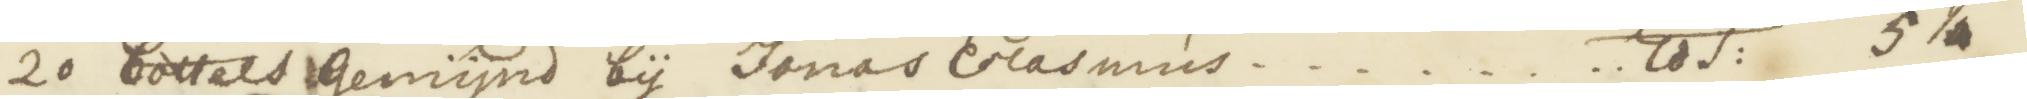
20 bottels gemijnd bij Jonas Erasmus . . . . . . . . rds: 5 1/4
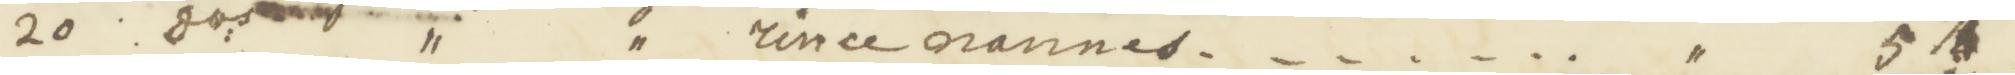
20 d:os „ „ rince nannes - - - . - . . „ 5 1/4
